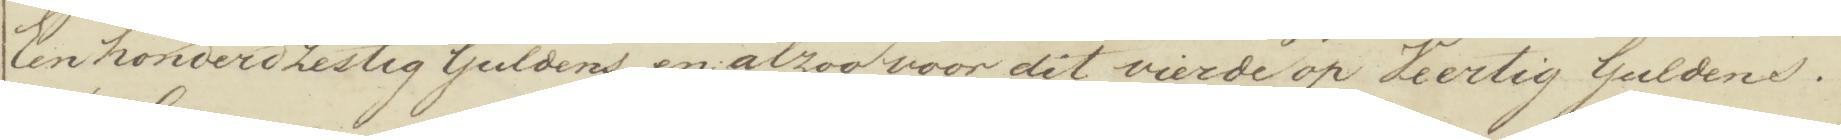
Een honderd Zestig Guldens en alzoo voor dit vierde op Veertig Guldens.
